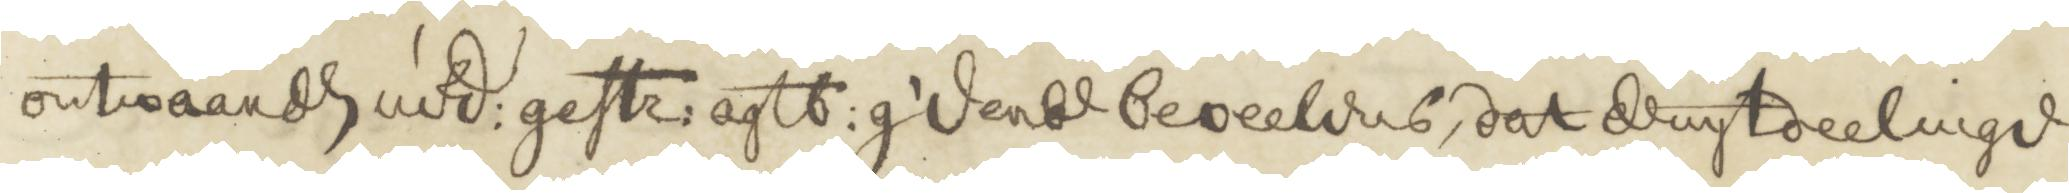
ontwaarden uEd: gestr: agtb: g’Eerde beveelens, dat de uijtdeelinge
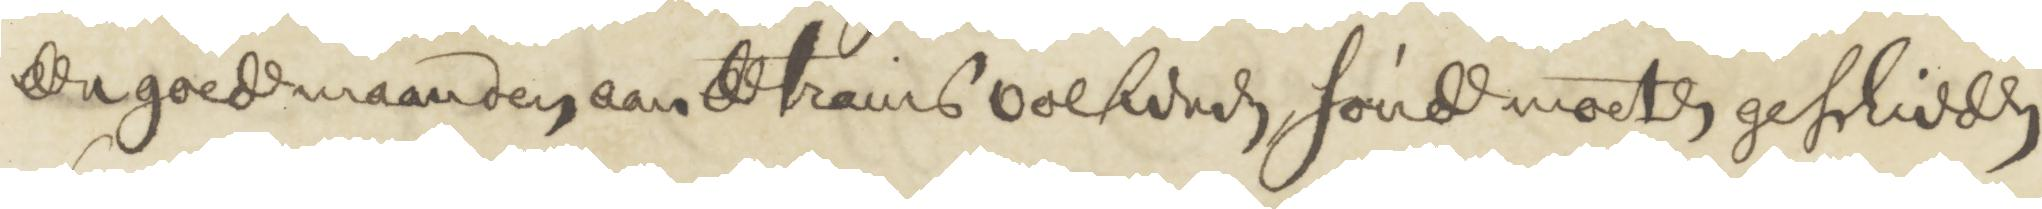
der goede maanden aan de trains volkeren, Soude moeten geschieden
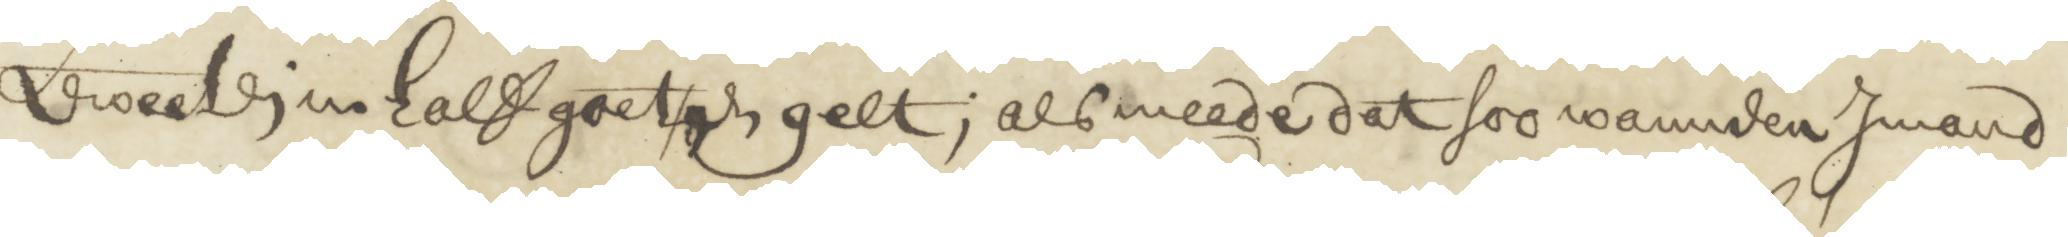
te weeten in half goet/ en gelt; als meede dat Soo wanneer Jmand
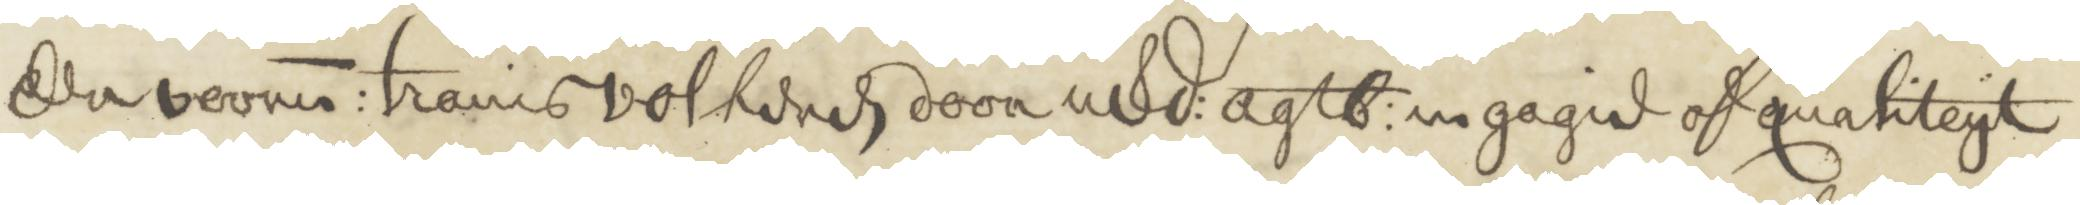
den voorn: trains volkeren door uEd: agtb: in gagie of qualiteijt
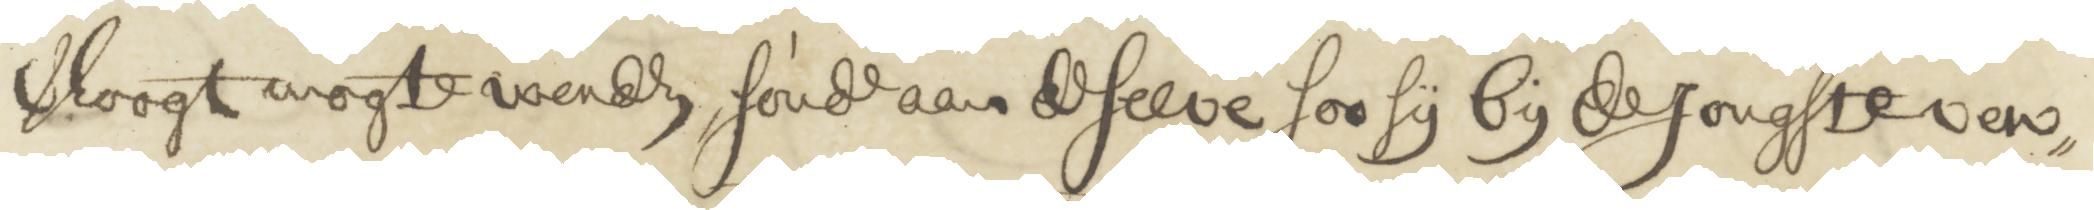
verhoogt mogte werden, soude aan deselve Soo Sij bij de Jongste ver„
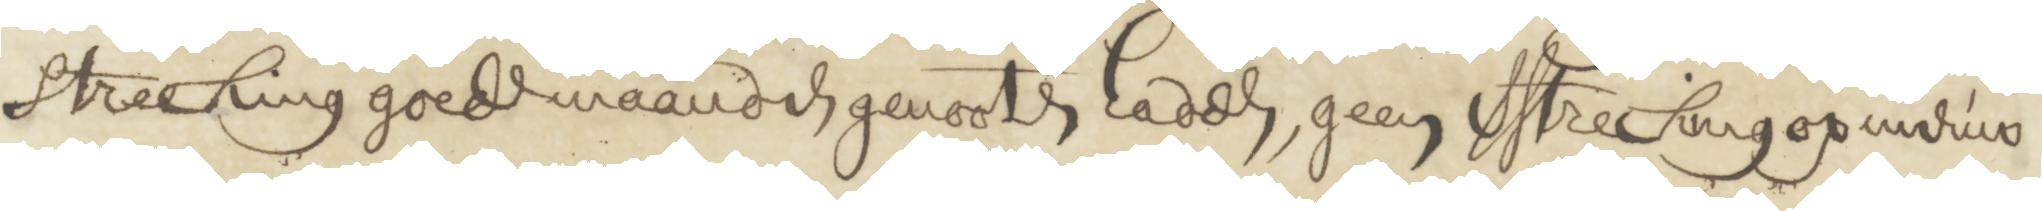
strecking goede maanden genooten hadden, geen verstrecking op nieuw
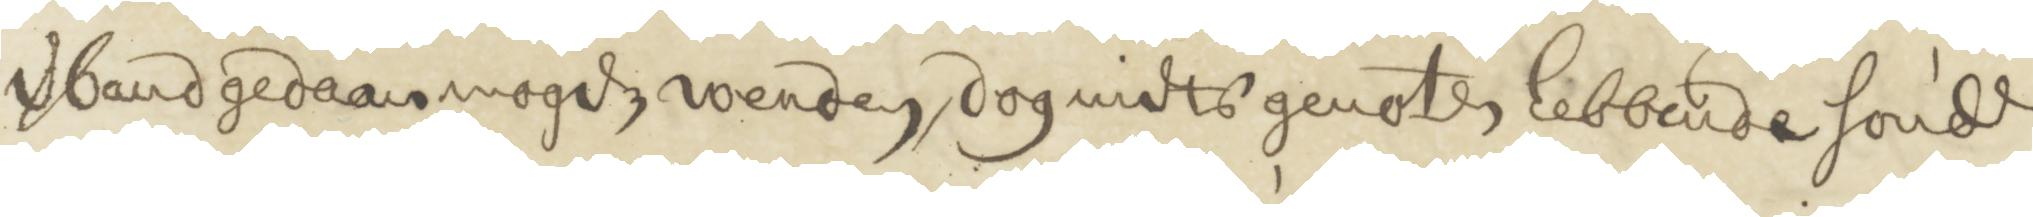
verband gedaan mogen werden, dog niets genoten hebbende Soude
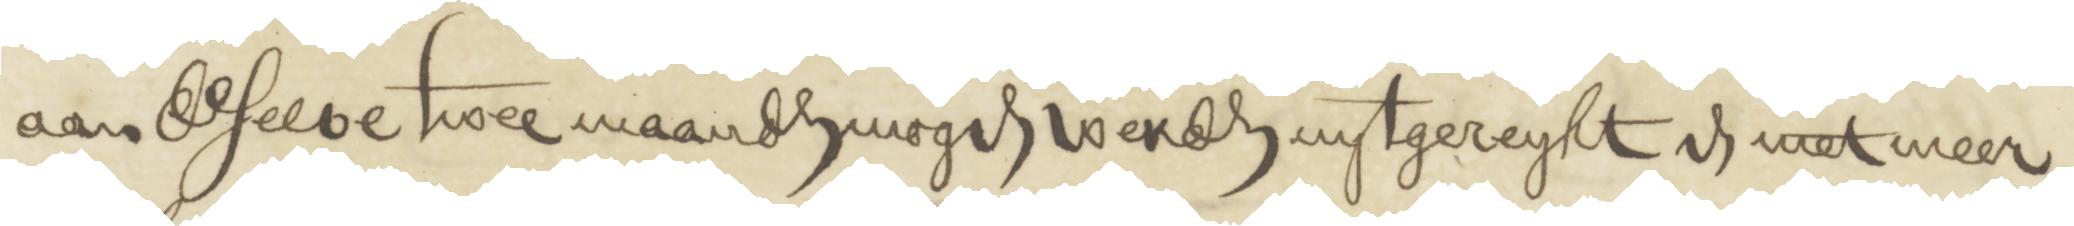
aan deselve twee maanden mogen werden uijtgereijkt en niet meer,
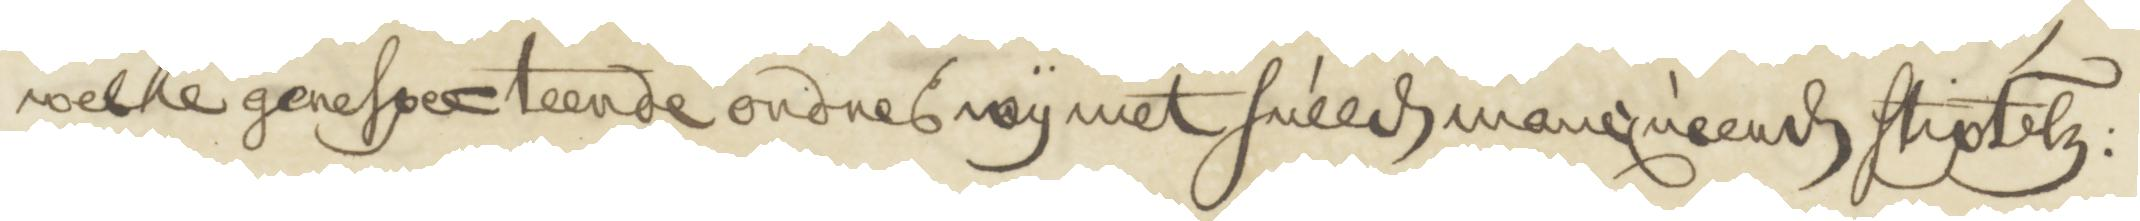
welke gerespecteerde ordres wij niet sullen manqueeren stiptelijk
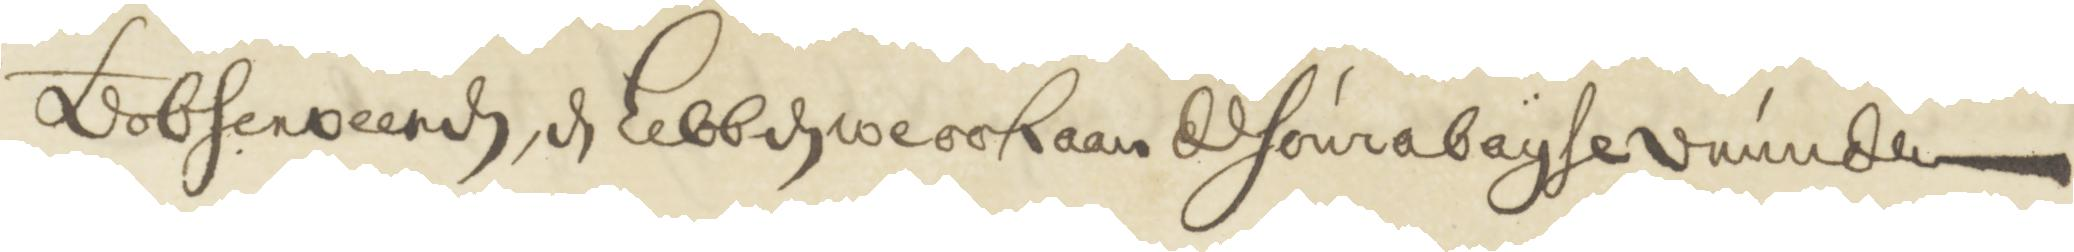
te observeeren, en hebben we ook aan de Sourabaijse vrunden
